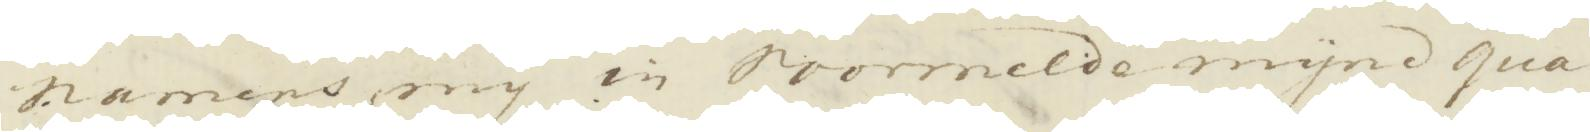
Namens, mij in voormelde mijne qua
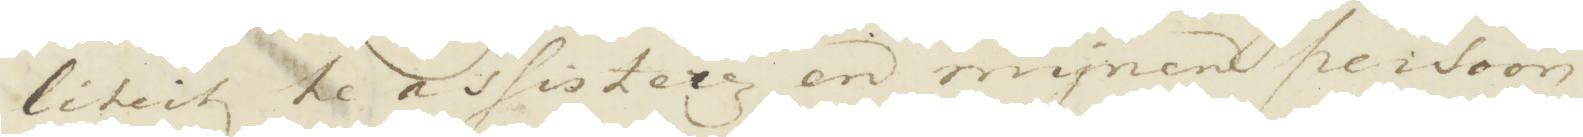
liteit te assisteren en mijnen persoon
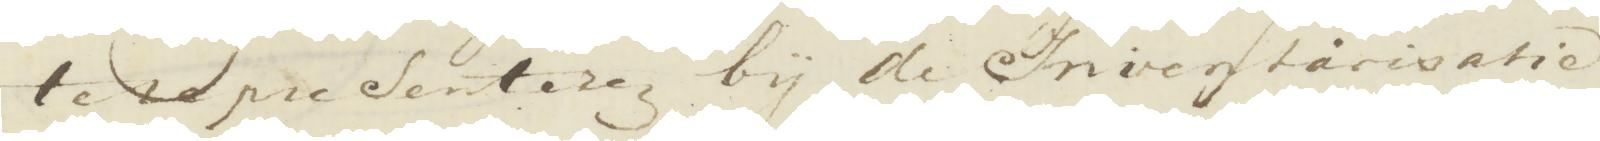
te representeren bij de Inventarisatie
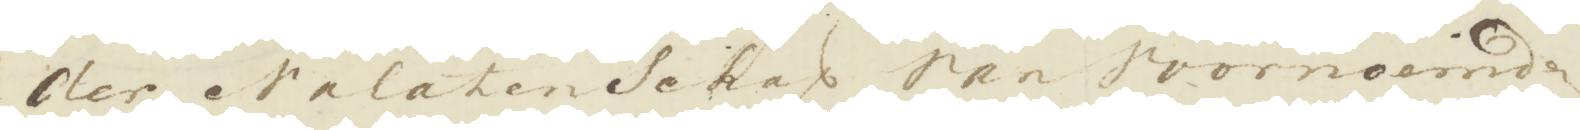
der Nalatenschap van voornoemden
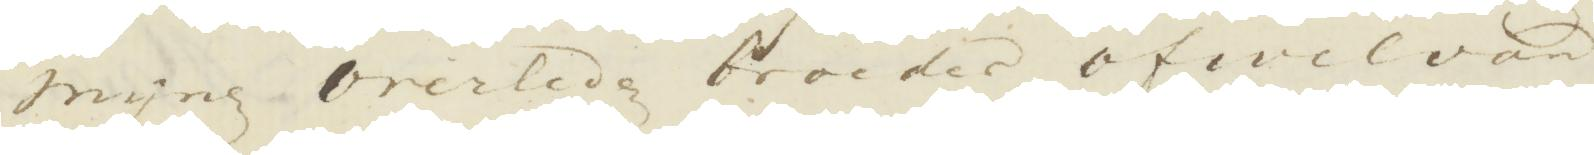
mijnen Overleden broeder of wel van
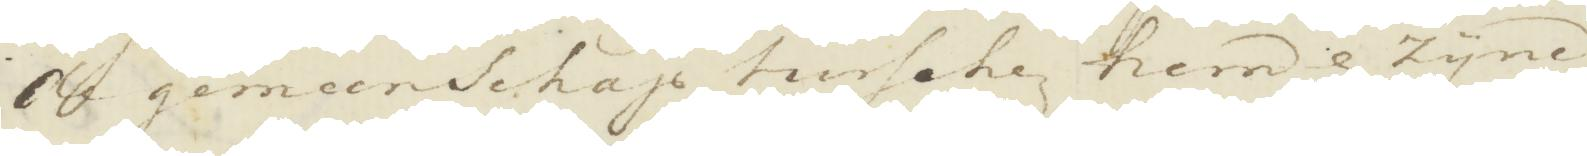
de gemeenschap tusschen hem en zijne
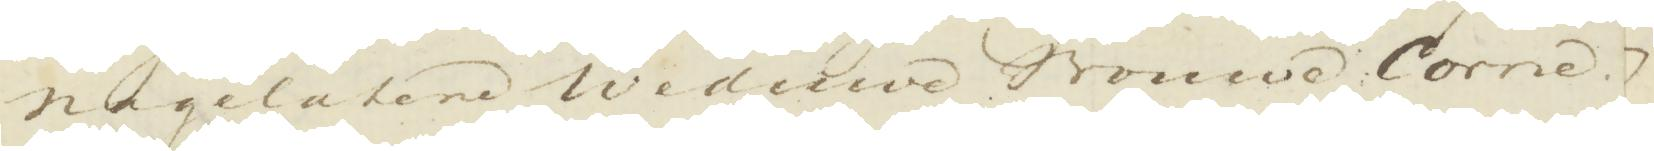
nagelatene weduwe Vrouwe Corne.
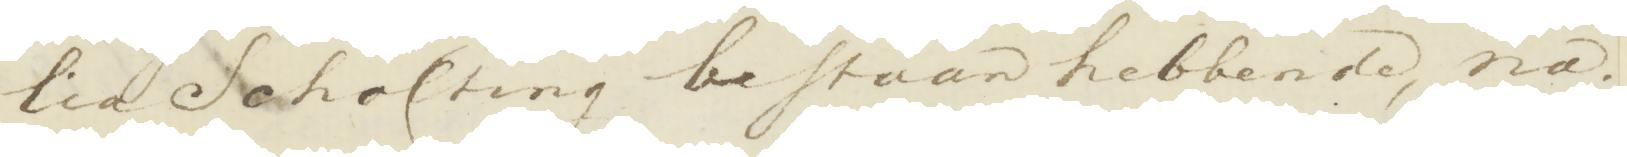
lia Scholting bestaan hebbende, na„
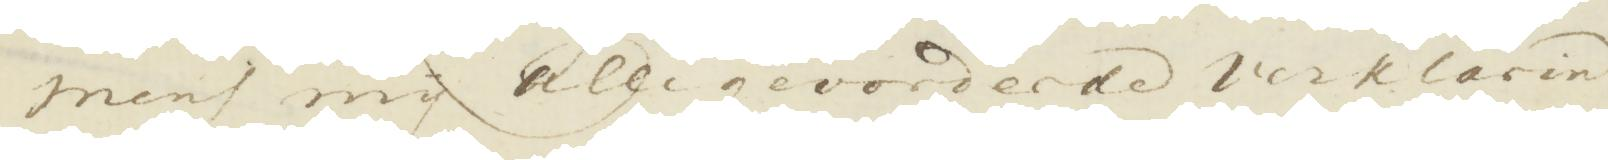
mens mij alle gevorderde verklarin
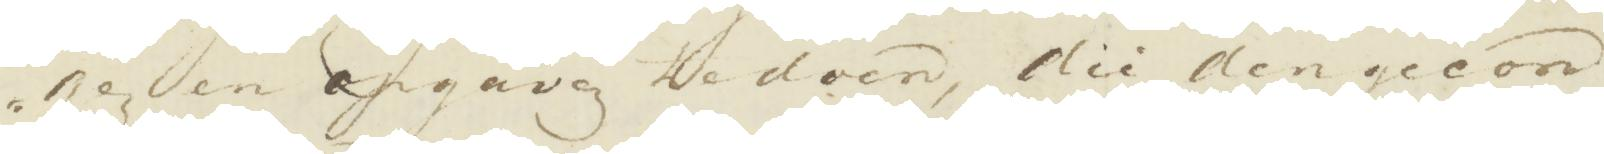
„gen en opgaven te doen, die den gecon
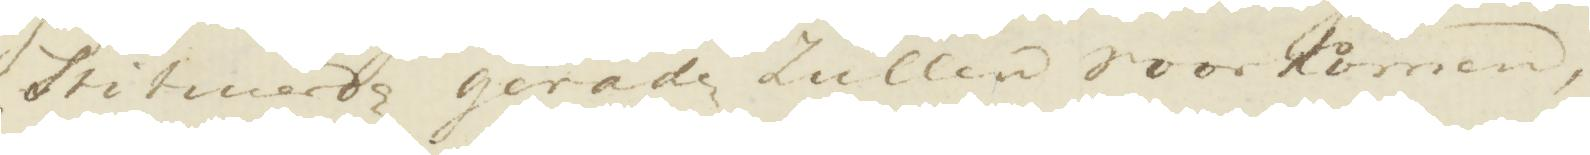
stitueerden geraden Zullen voorkomen,
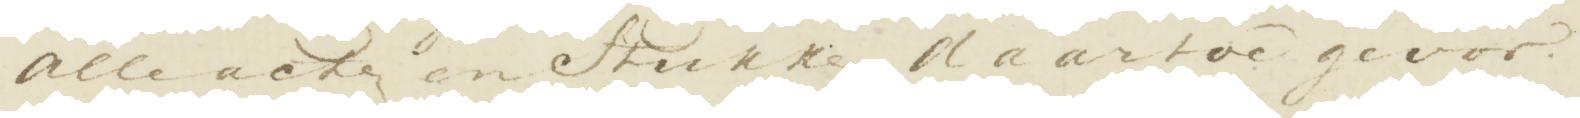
alle acten en Stukken daartoe gevor„
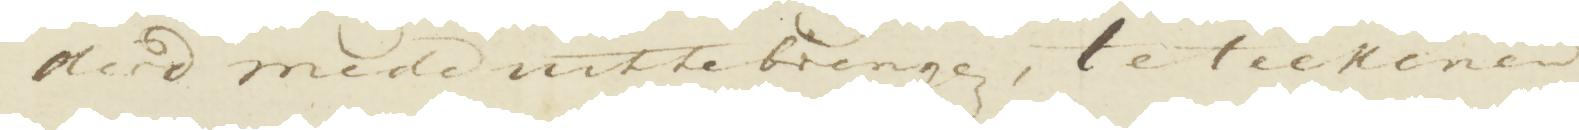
derd mede uit te brengen, te teekenen
